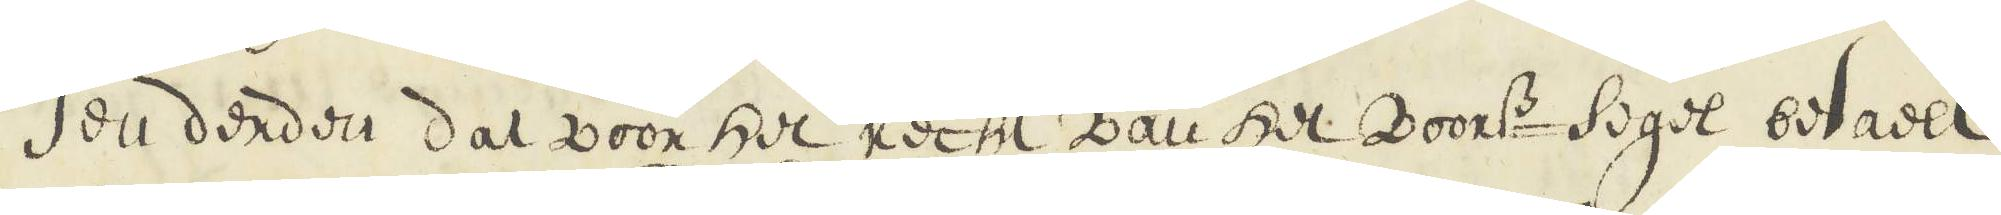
Ten derden dat voor het recht van het voors=z segel betaelt
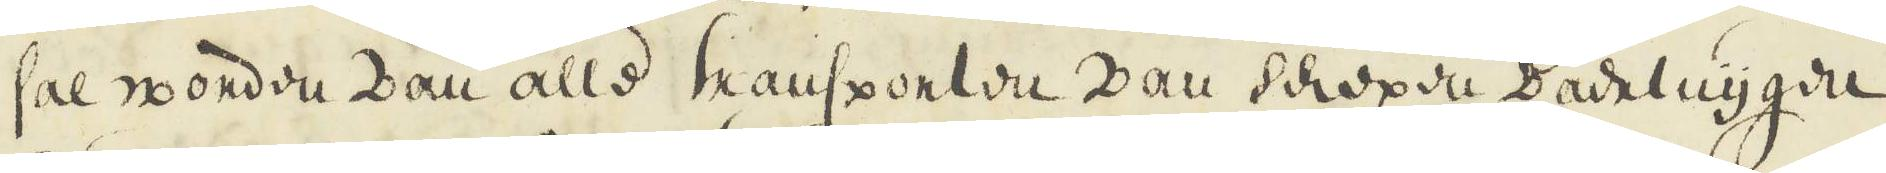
sal worden van alle transporten van schepen vaertuijgen
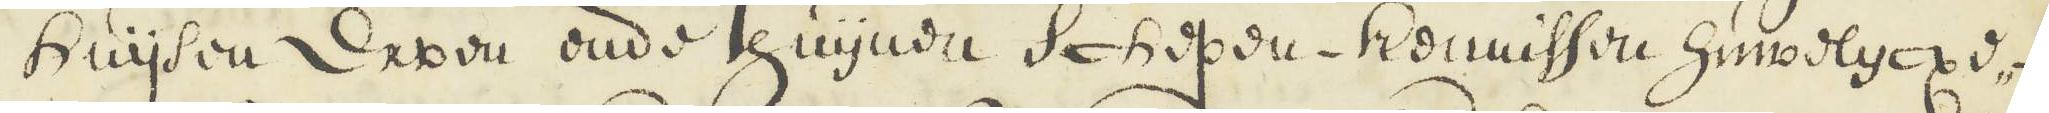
huijsen Erven ende thuijnen schepen-kennissen huwelijcxe„-
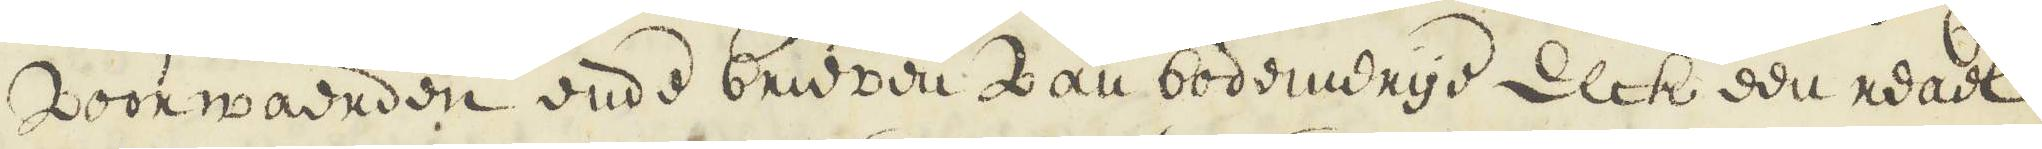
voorwaerden ende brieven van bodemerije Elck een reael
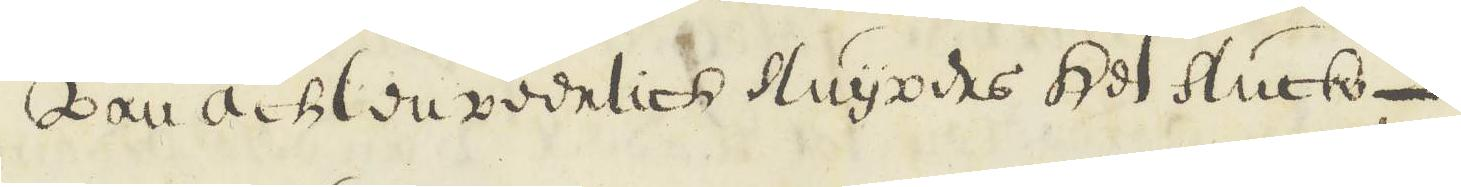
van achten veertich stuijvers het stuck—
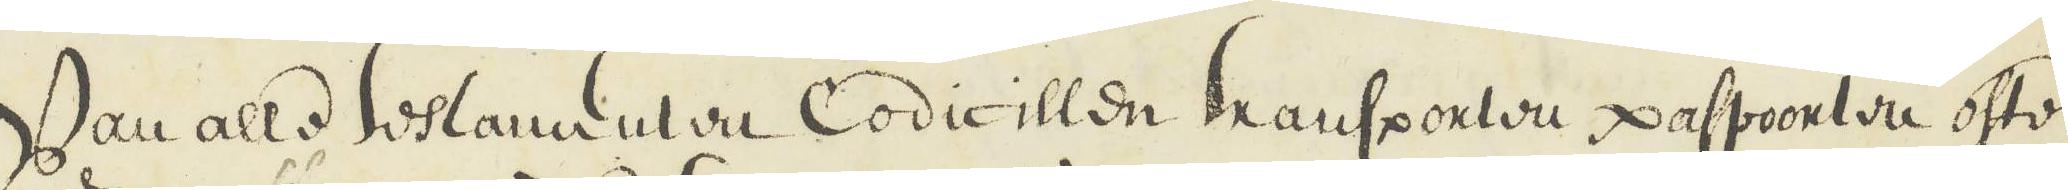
Van alle testamenten Codicillen transporten paspoorten ofte
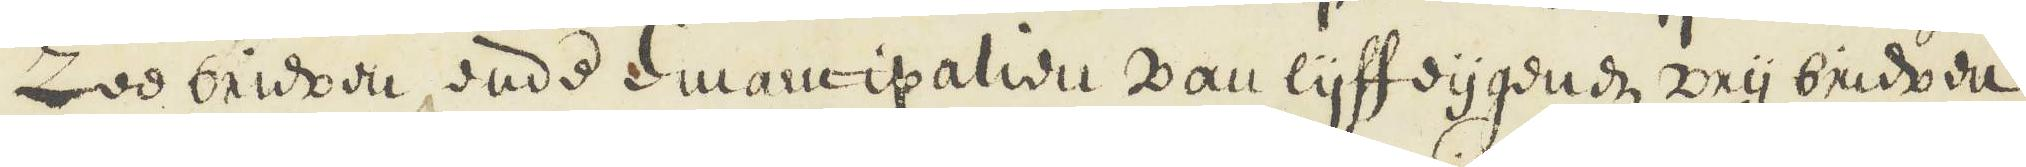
zee brieven ende Emancipatien van lijffeijgen en vrij brieven
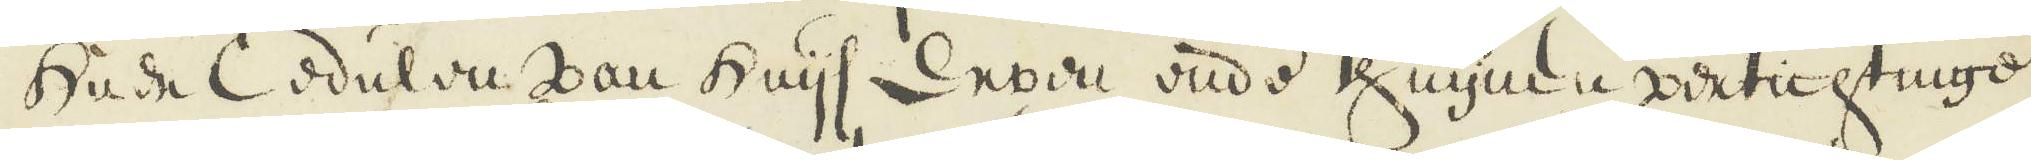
Huer Cedulen van Huijs Erven ende thuijnen vertichtinge
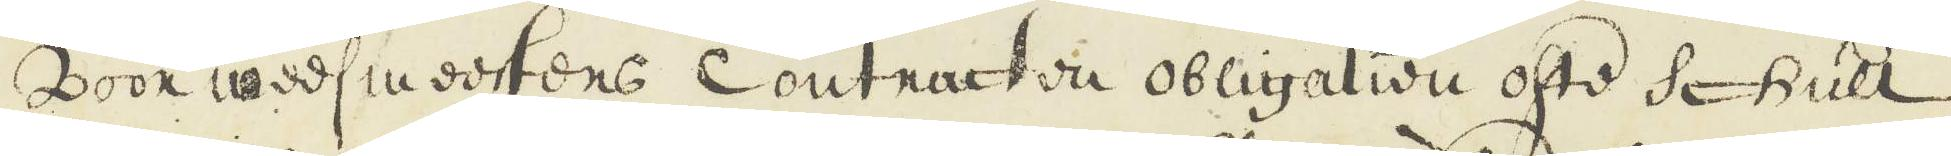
voor weesmeesters Contracten obligatien ofte schult
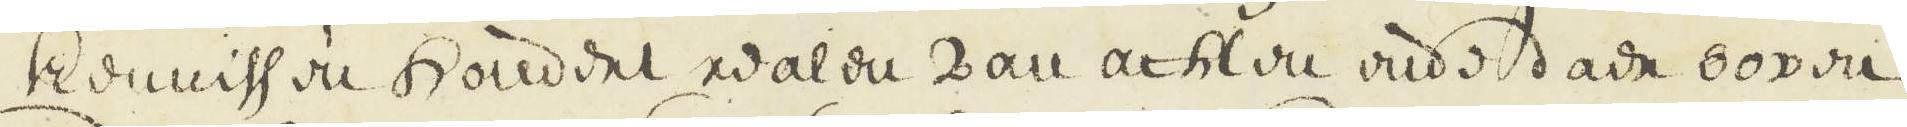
kennissen hondert realen van achten ende daer boven
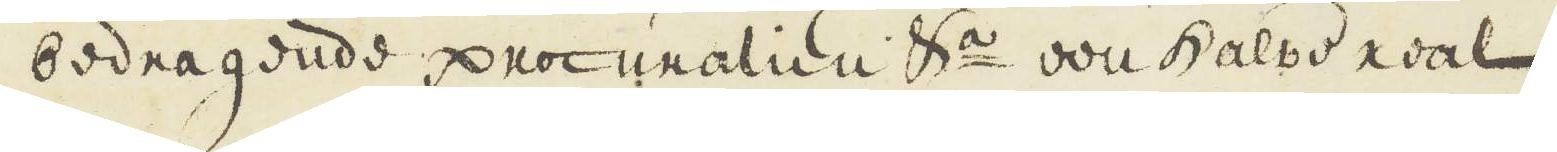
bedragende procuratien &=a een halve real
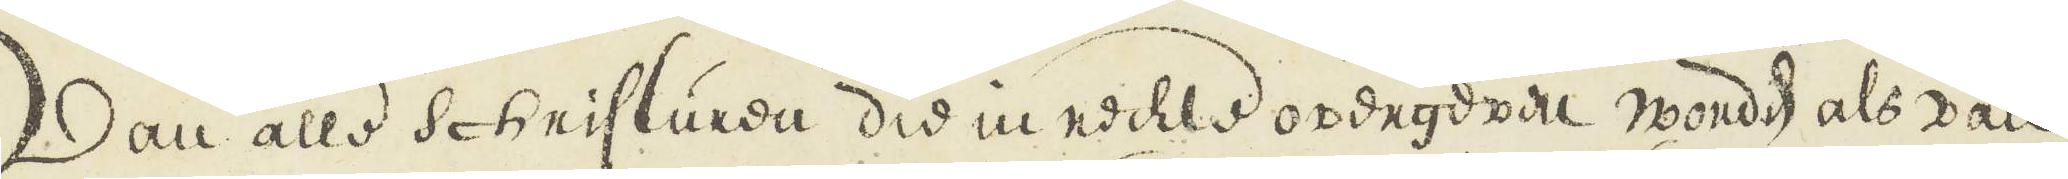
Dan alle schrifturen die in rechte overgeven worden als van
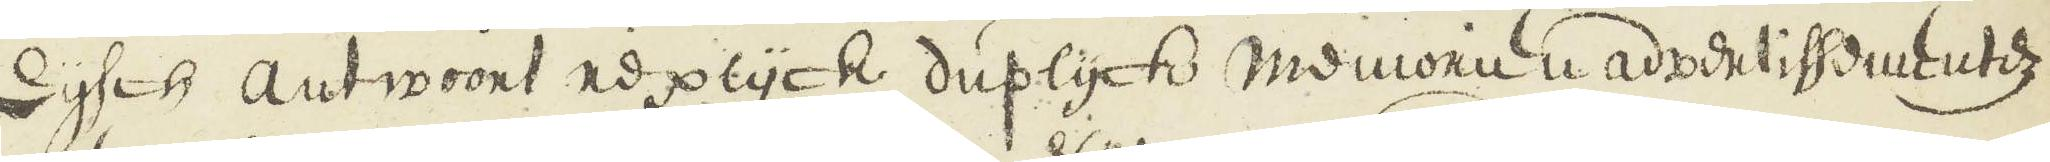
Eijsch antwoort replijck duplijck memorien advertissementen
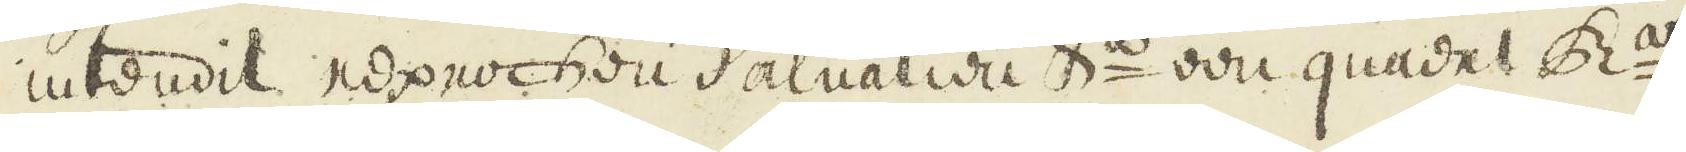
intendit reprochen saluatien &=a een quaert R=as
